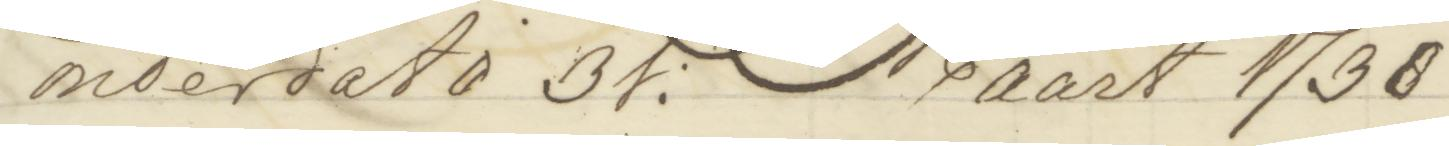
onder dato 31:' Maart 1738
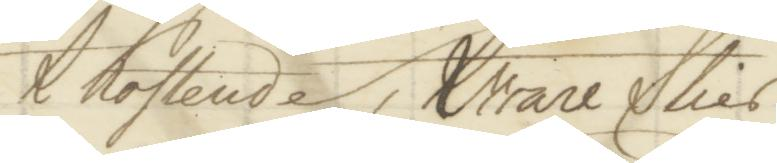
t kostende, 't ware verlies
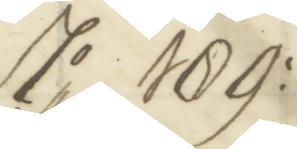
r„o 189:
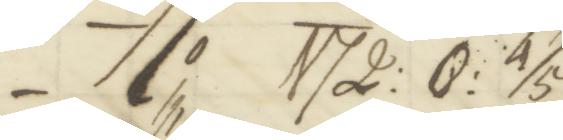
r„o 172: 8: 4/5
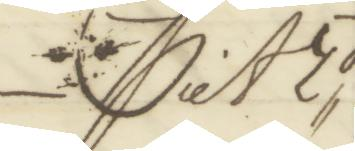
Piet r„sr
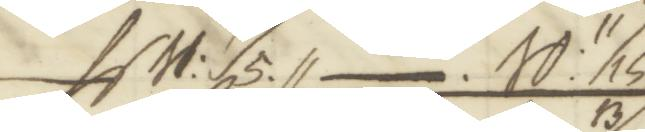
11: 1/5.„ —.10: 11/15.
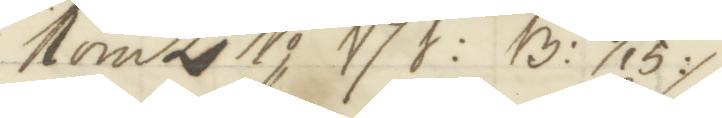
Komt r„o 171: 13: 13/15:
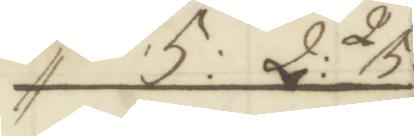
„ 5: 2: 2/5
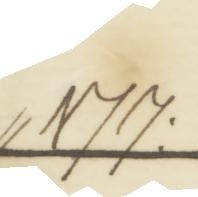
„ 177:
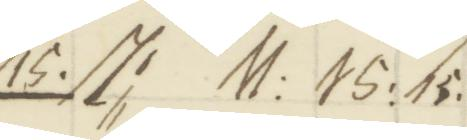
4/15. r„o 11: 15: 11/15.
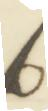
6 163/180 r„m
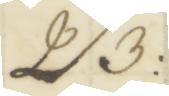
2 2/3:
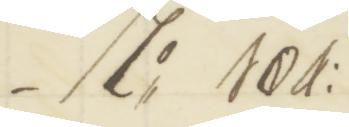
r„o 184:
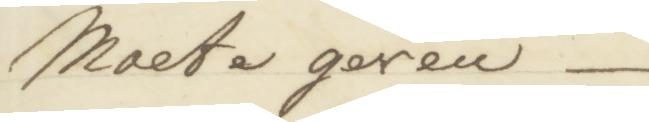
moete geven —
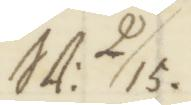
14: 2/15.
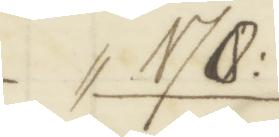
„ 178:
